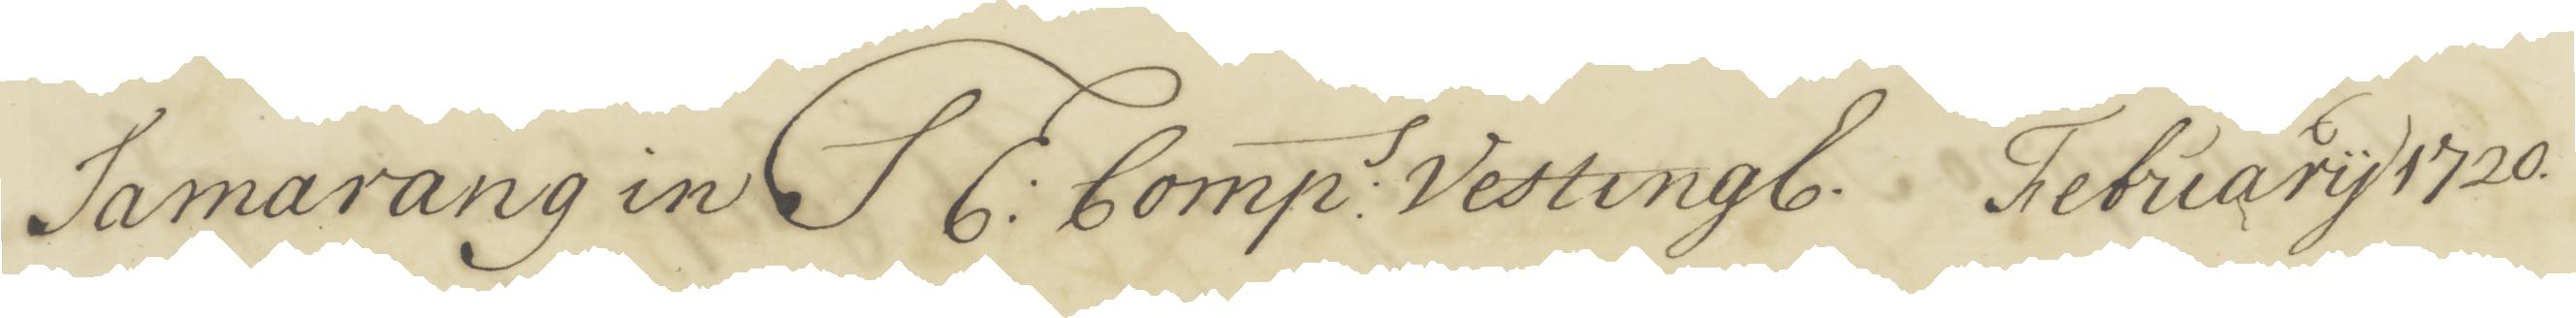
Samarang in S E: Comp:s vestingh. Februarij 1720.
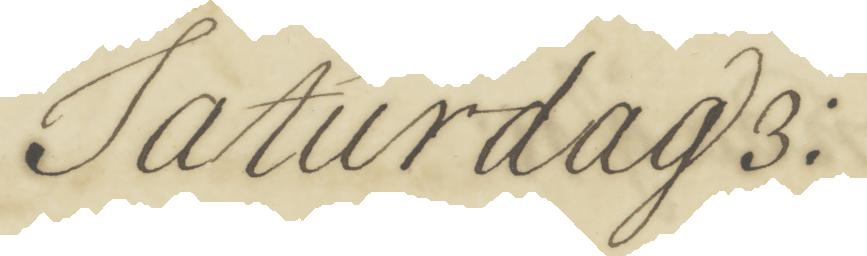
Saturdag 3:'
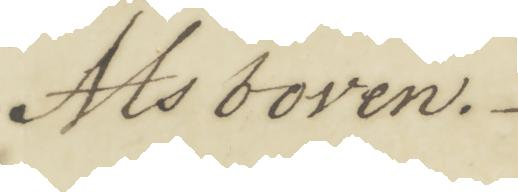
Als boven. —
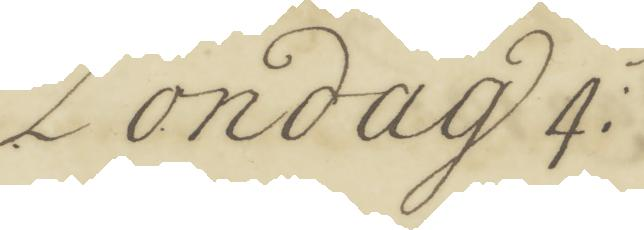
Zondag 4:'
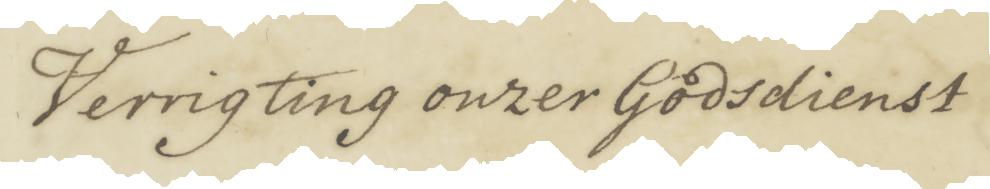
Verrigting onzer Godsdienst
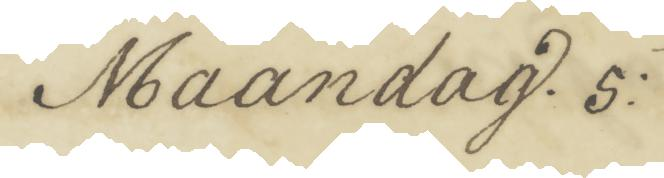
Maandag. 5:
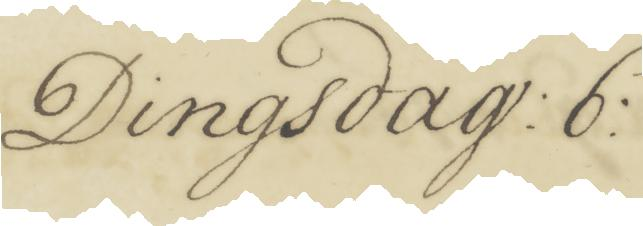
Dingsdag: 6:
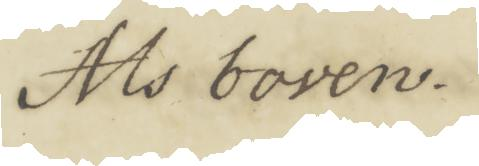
Als boven.
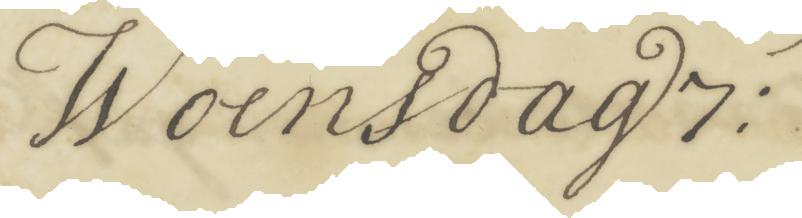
Woensdag 7:'
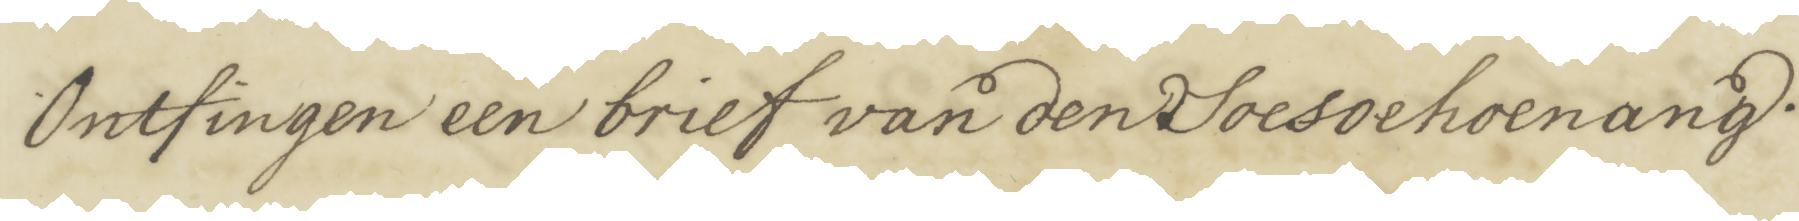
Ontfingen een brief van den Soesoehoenang
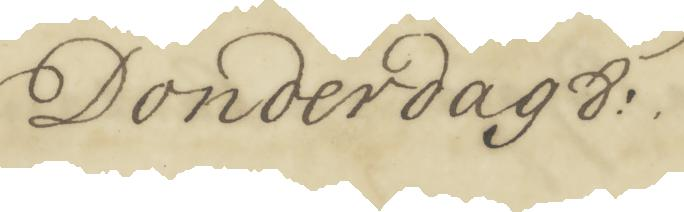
Donderdag 8:'.
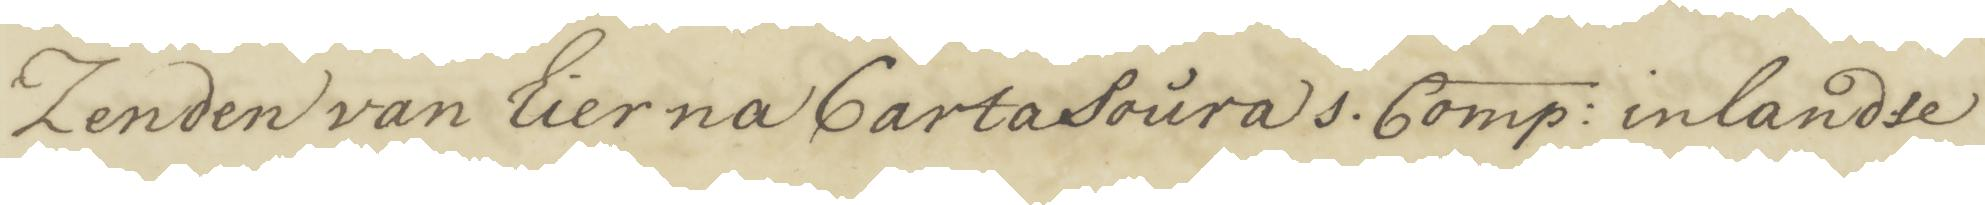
Zenden van hier na Cartasoura s. Comp: inlandse
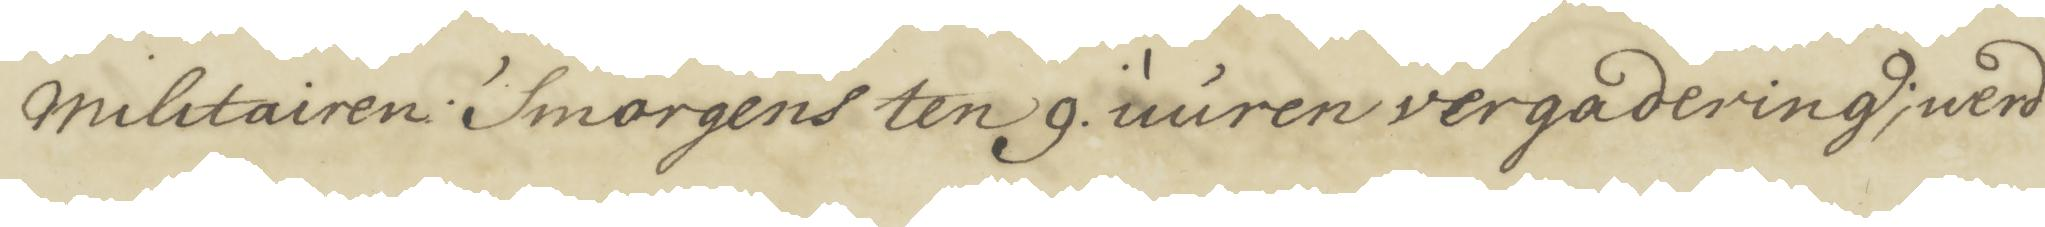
militairen: 'smorgens ten 9. uuren vergadering; werd
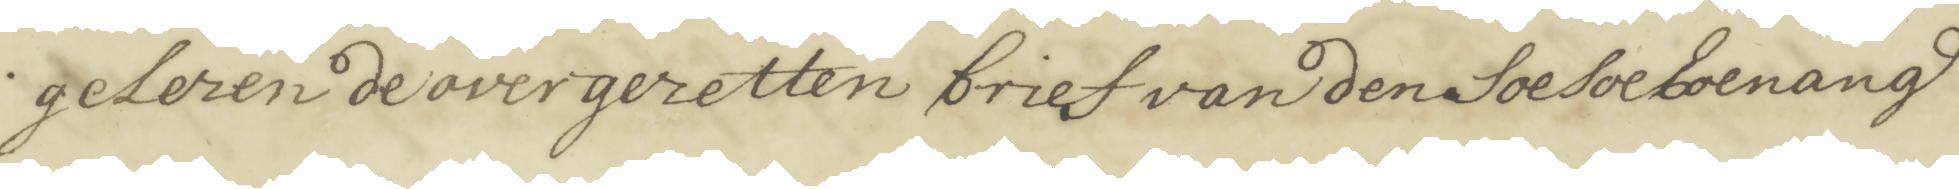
gelezen de overgezetten brief van den soesoehoenang
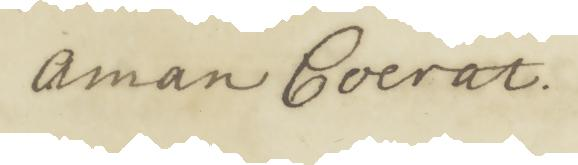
Aman Coerat.
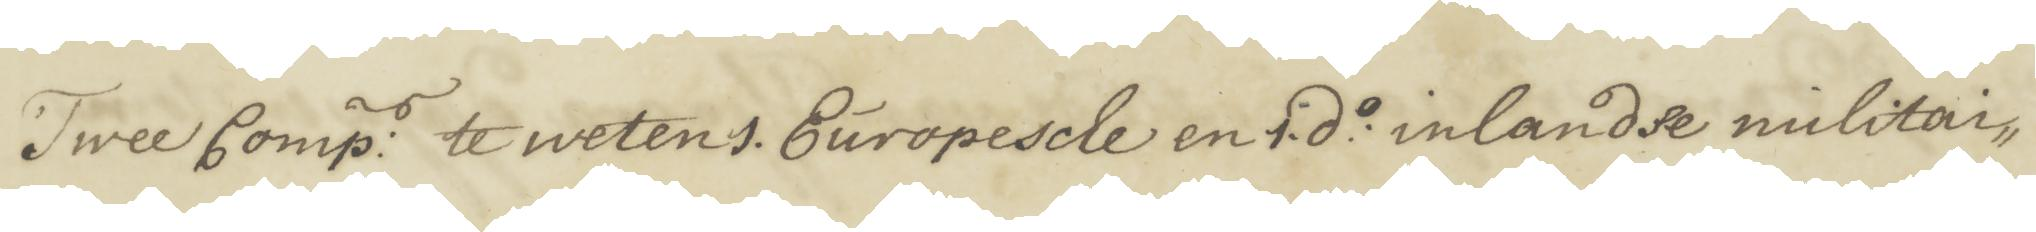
Twee Comp:s te weten 1. Europesche en 1. d:o inlandse militai„
